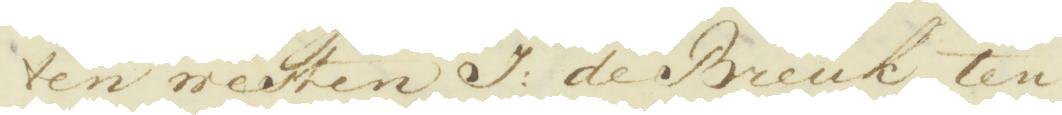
ten westen I: de Breuk, ten
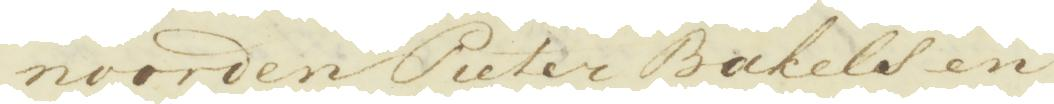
noorden Pieter Bakels en
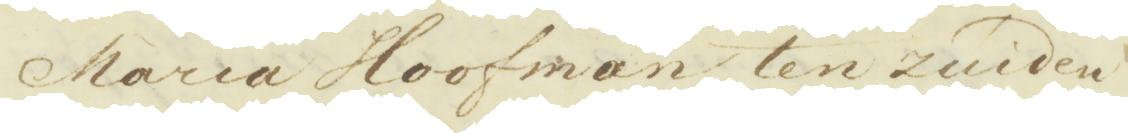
Maria Hoofman, ten zuiden
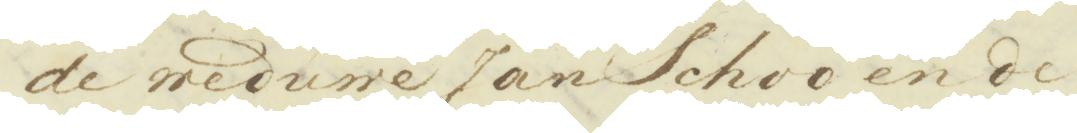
de weduwe Jan Schoo en de
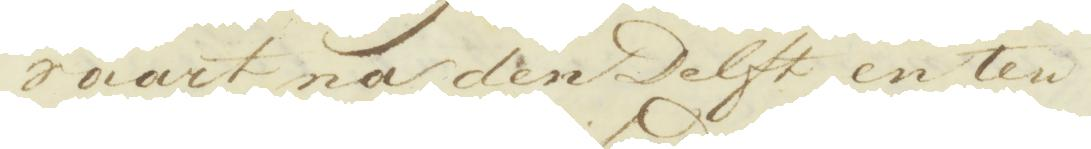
vaart na den Delft en ten
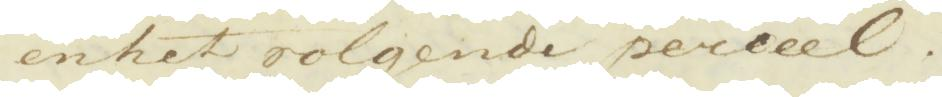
enhet volgende perceel.
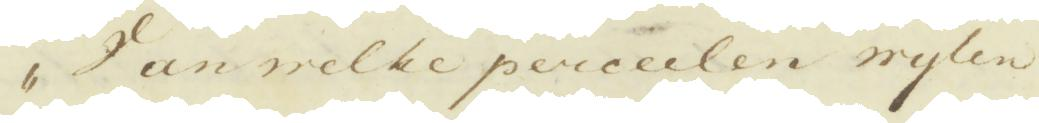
„ Van welke perceelen wylen
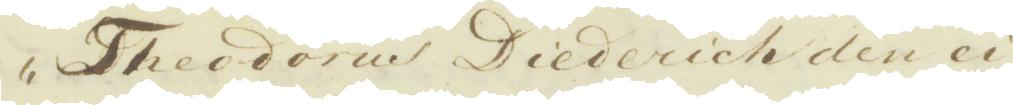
„ Theodorus Diederich den ei
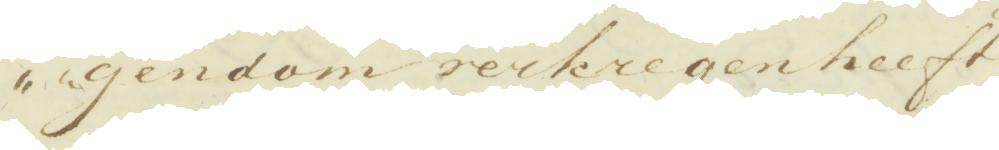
„ gendom verkregen heeft
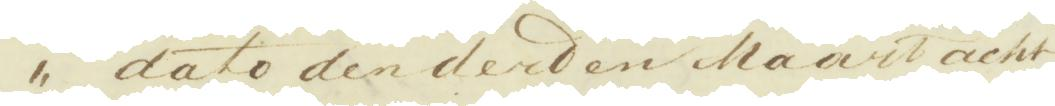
„ dato den derden Maart acht
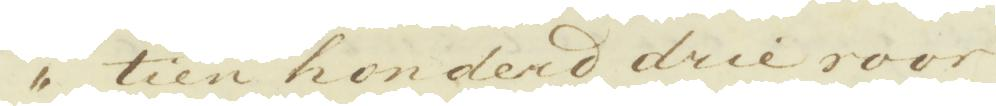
„ tien honderd drie voor
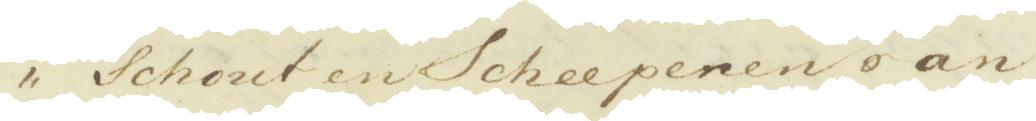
„ schout en Scheepenen van
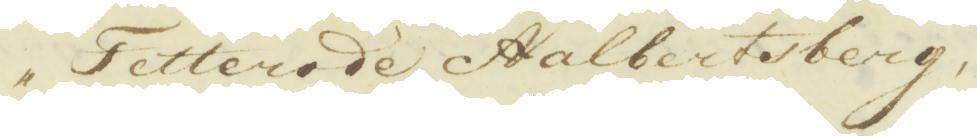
„ Tetterode, Aalbertsberg,
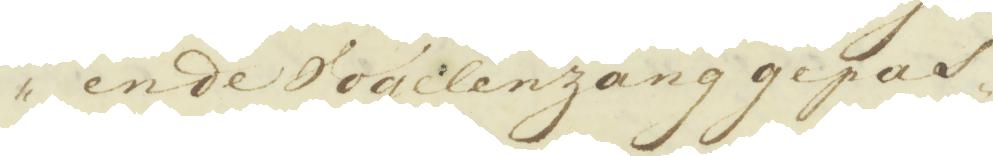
„ en de Vogelenzang gepas„
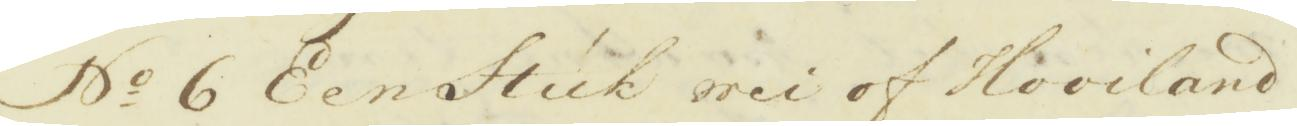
N=o 6 Een Stuk wei of Hooiland
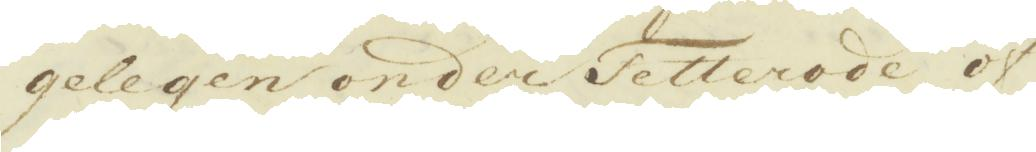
gelegen onder Tetterode of
